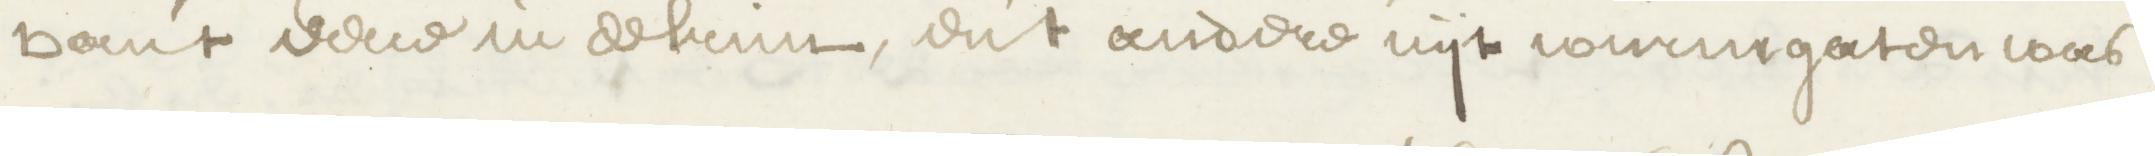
van ’t Eene in de kim, en't andere uijt wurmgaten was
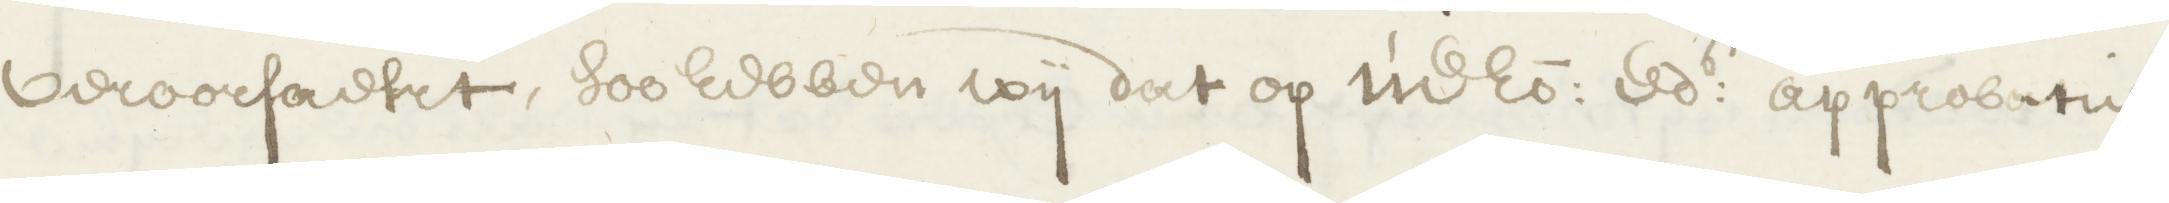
veroorsaekt, soo hebben wij dat op uE ho: Ed:s approbatie
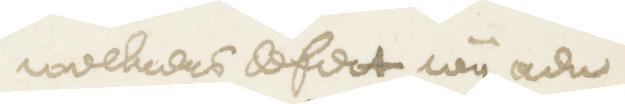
welkers defect wij aen
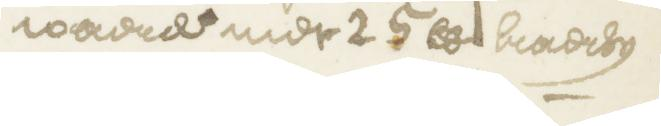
waerde met 25 lb kaersen
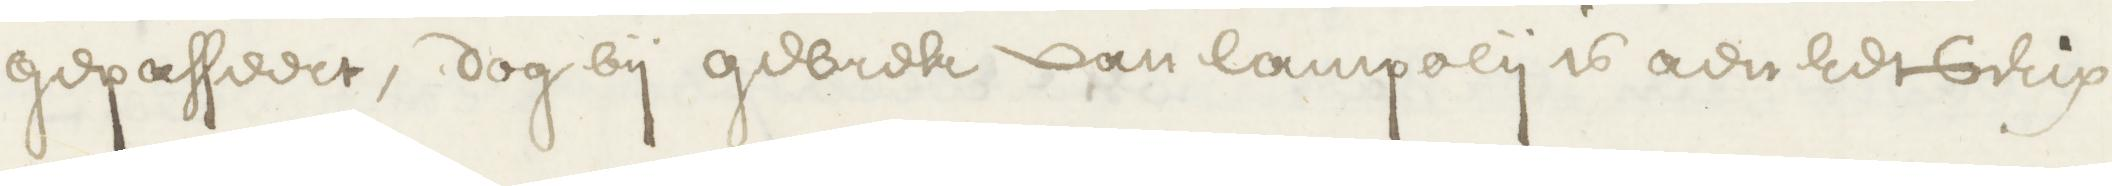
gepasseert, dog bij gebrek van lampolij is aen het schip
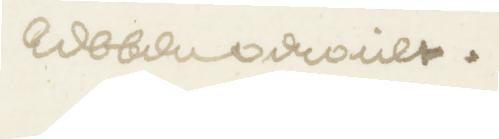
hebben vervult.
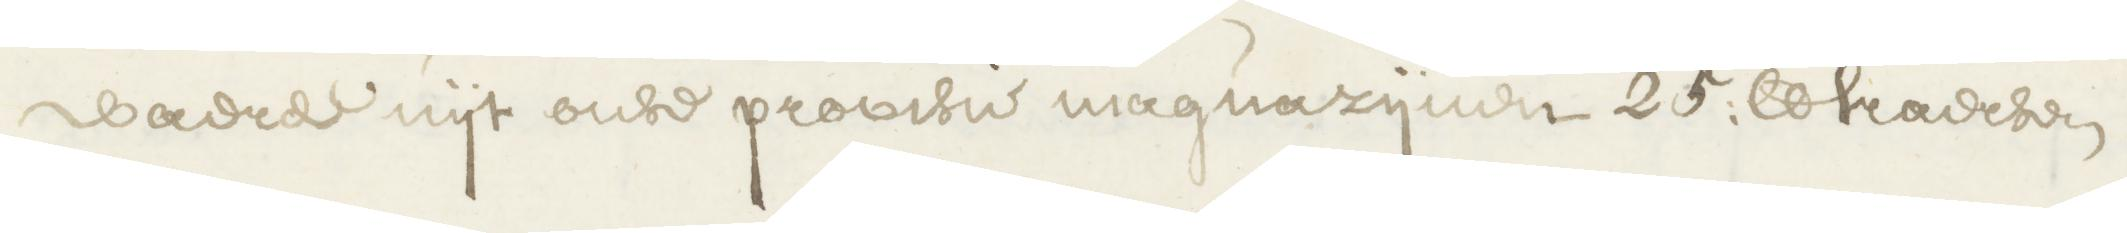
waerde uijt onse provisie maguazijnen 25: lb kaersen
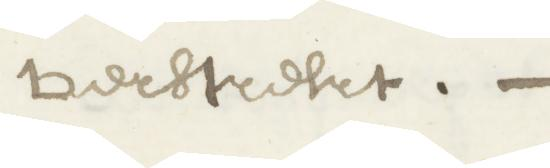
verstrekt.
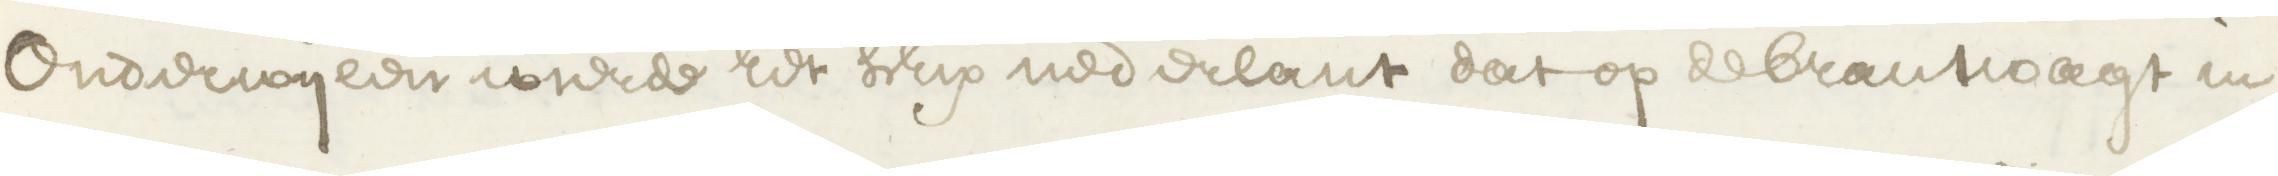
Onderwijlen wierde het schip nederlant dat op de brantwagt in
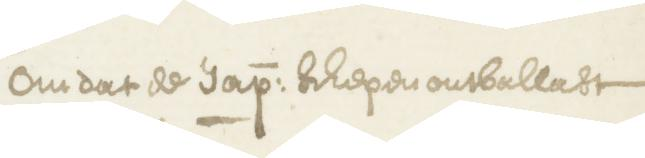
om dat de Jap: schepen ontballast
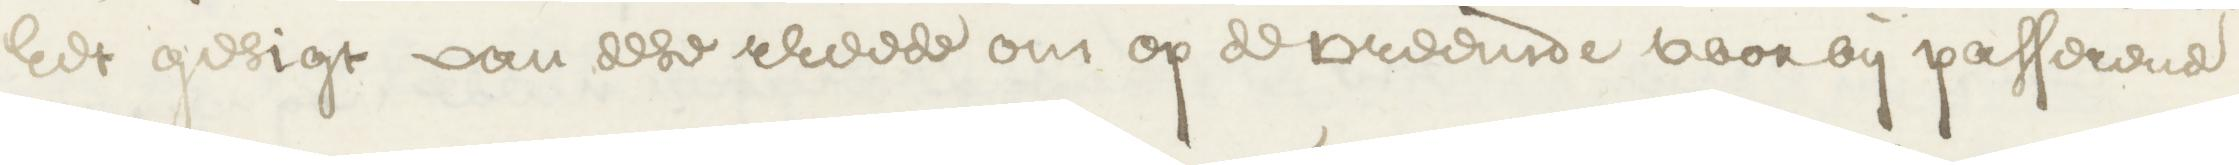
het gesigt van dese rheede om op de vreemde voorbij passerende
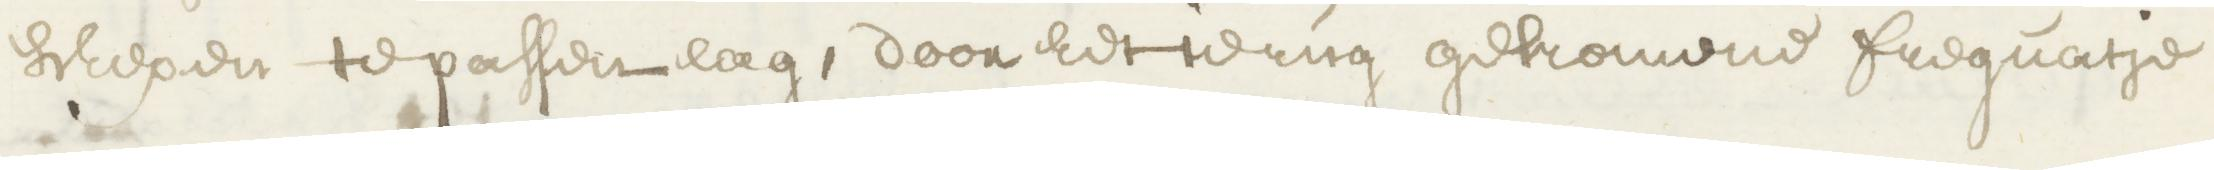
schepen te passen lag, door het terug gekomene freguatje
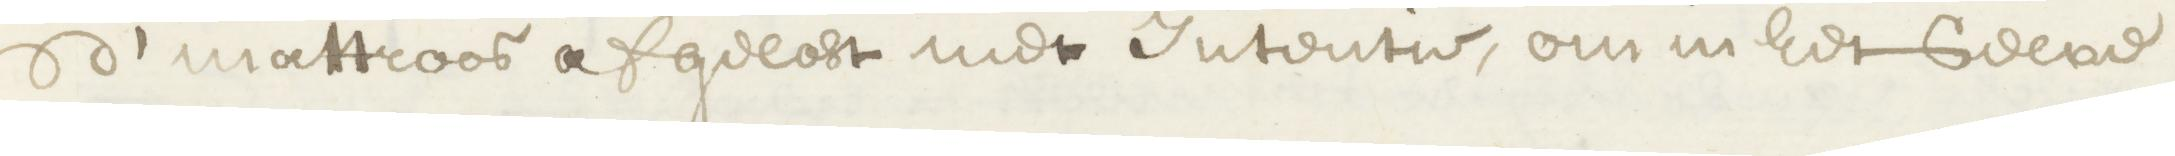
d’ mattroos afgelost met Intentie, om in het selve
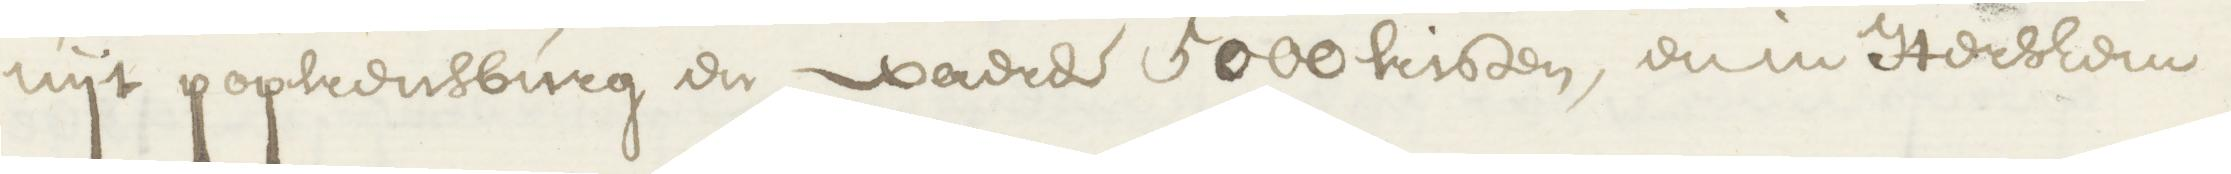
uijt popkensburg en waerde 5000 kisten, en in Itershem
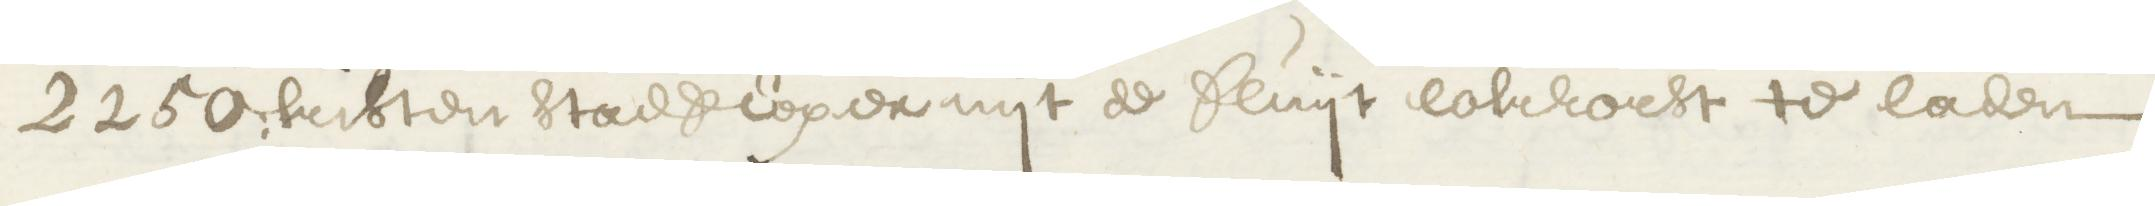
2250: kisten staefcoper uijt de fluijt lokhorst te laden
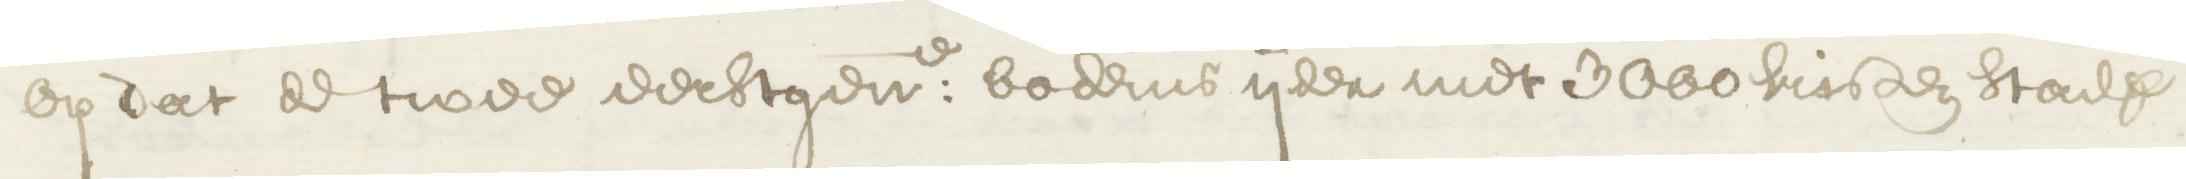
op dat de twee eerstgen:e bodems ijder met 3000 kisten staef
